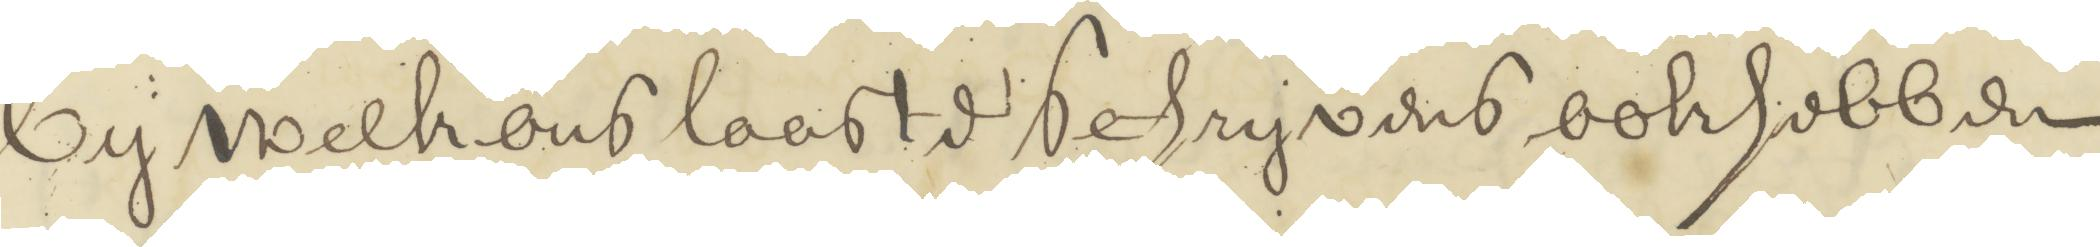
bij welk ons laaste Schrijvens ook hebben
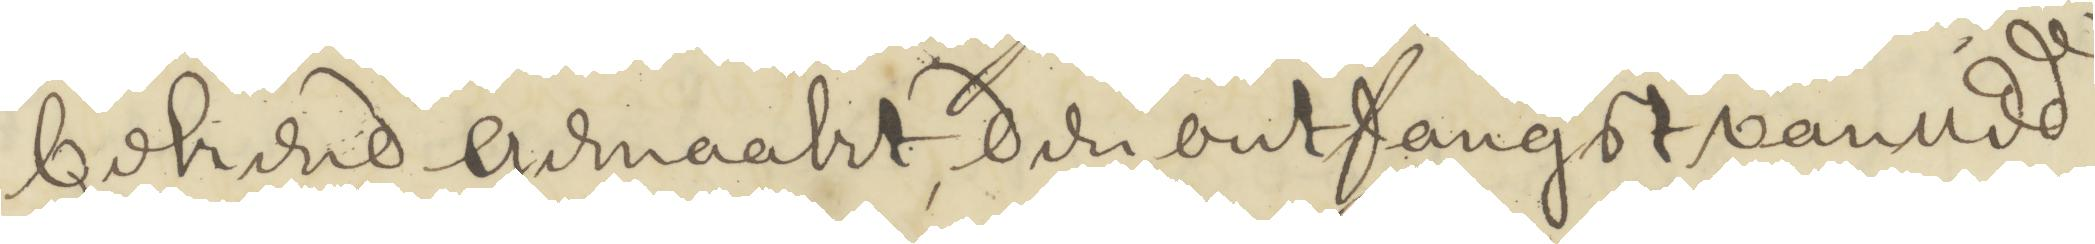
bekend gemaakt, den ontfangst van uEd:e
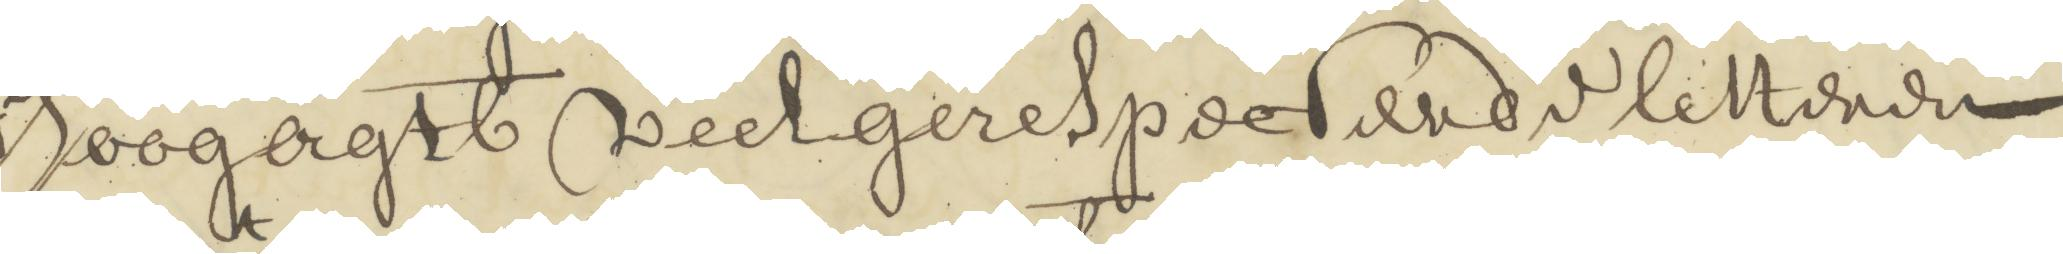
Hoog agtb veel gerespecteerde letteren
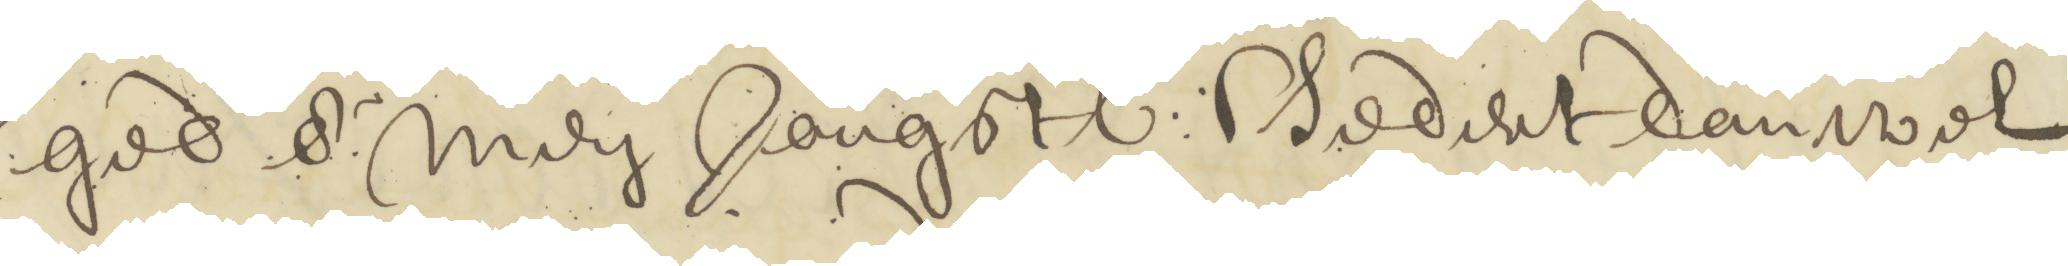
ged.t 8:' Meij Jongstl: t Sedert dan wel
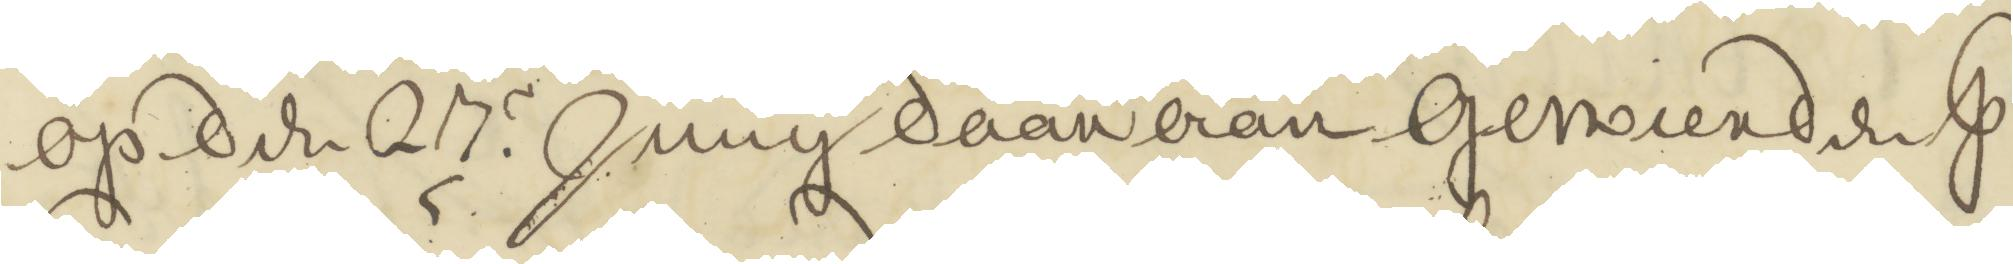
op den 27.' Junij daar aan gewierden p.r
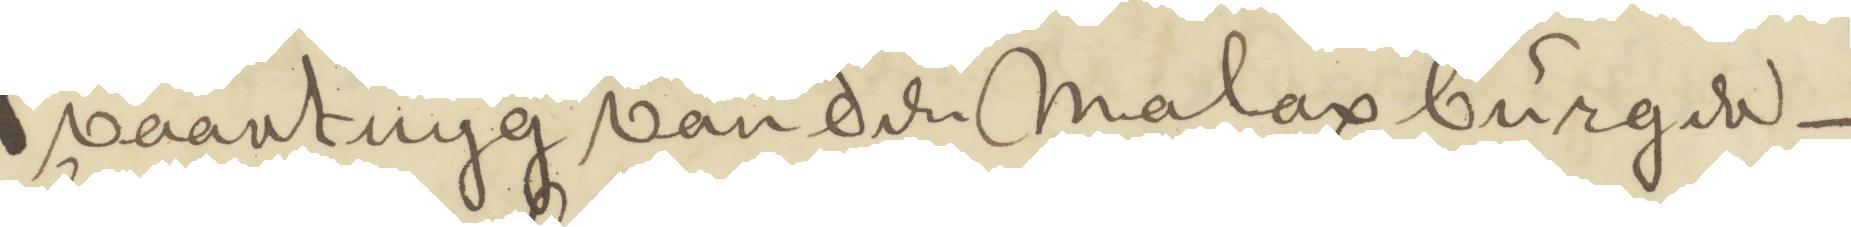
t vaartuijg van den malax burger-
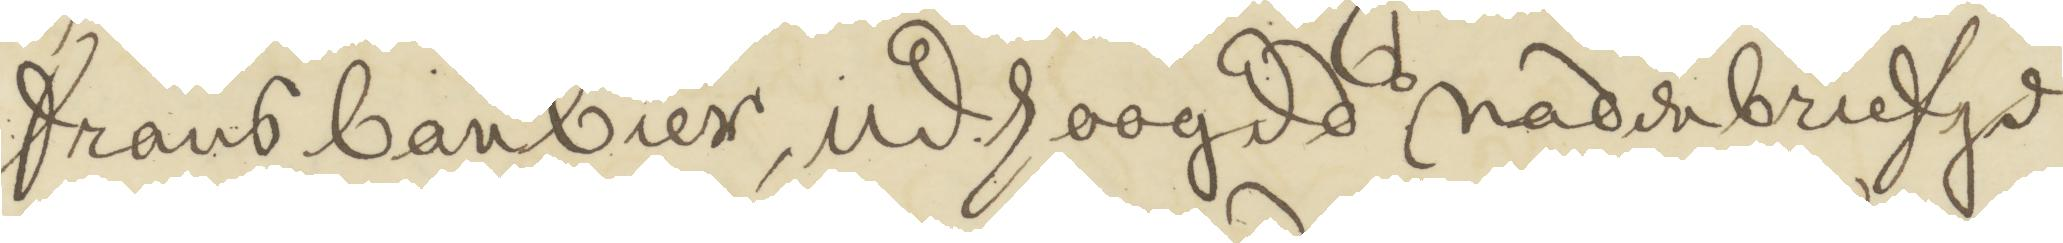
frans barbier, uE: hoog Ed:s nader briefje
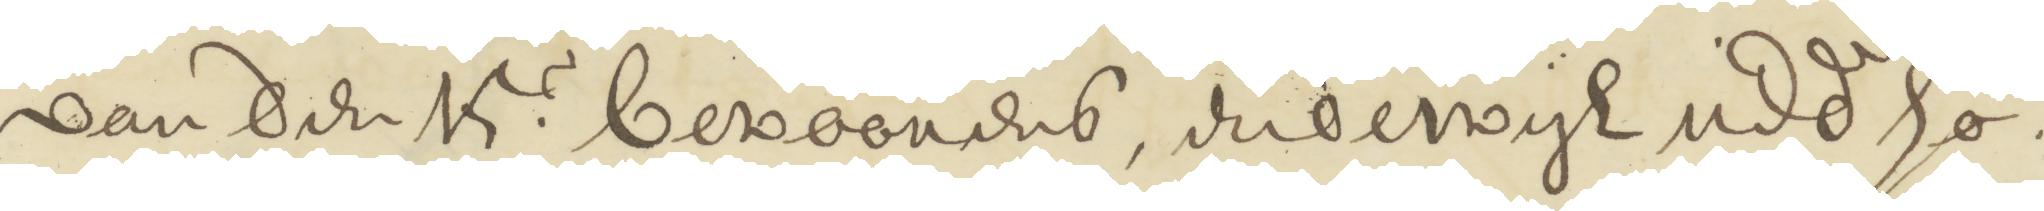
van den 15:' bevoorens, ende wijl uEd ho.
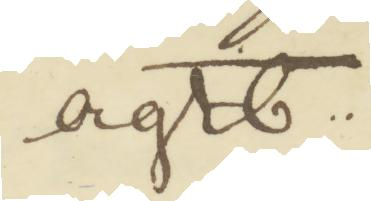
agtb..
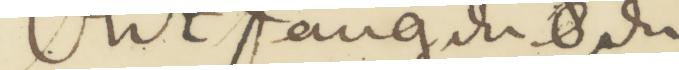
Ontfangen den
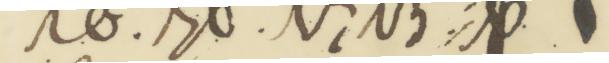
10:' 7b: 1713: p:r t
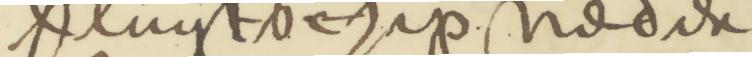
fluijtschip neder
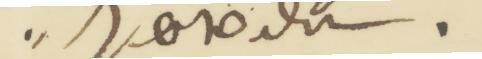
„hoven.
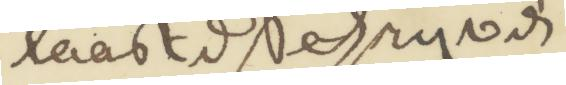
laaste Schrijven
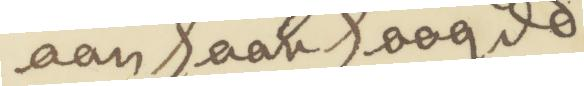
aan haar hoog Ed:s
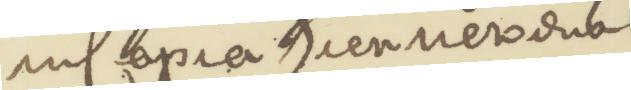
in Copia hier nevens
